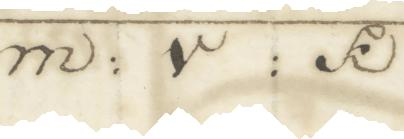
m : v : k
